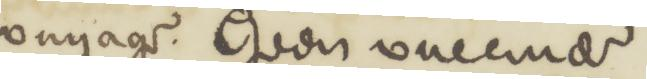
vryage. Geen vreemde
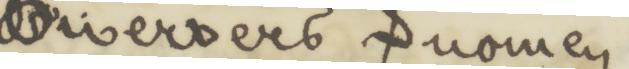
swervers vernomen
